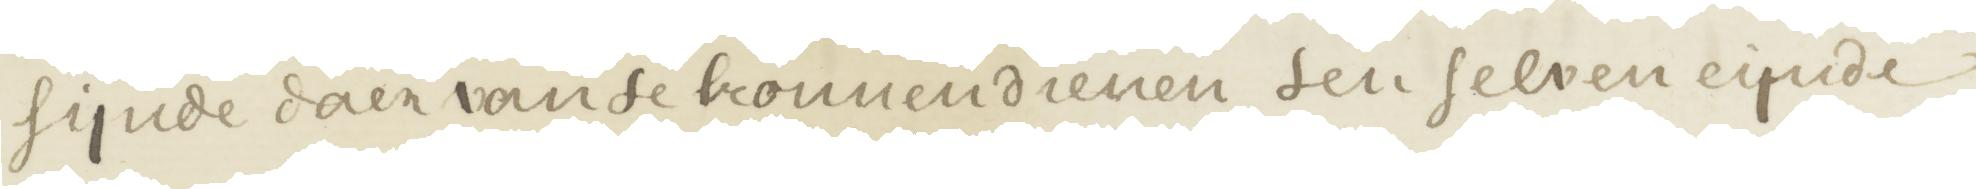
sijnde daer van te konnen dienen den selven eijnde
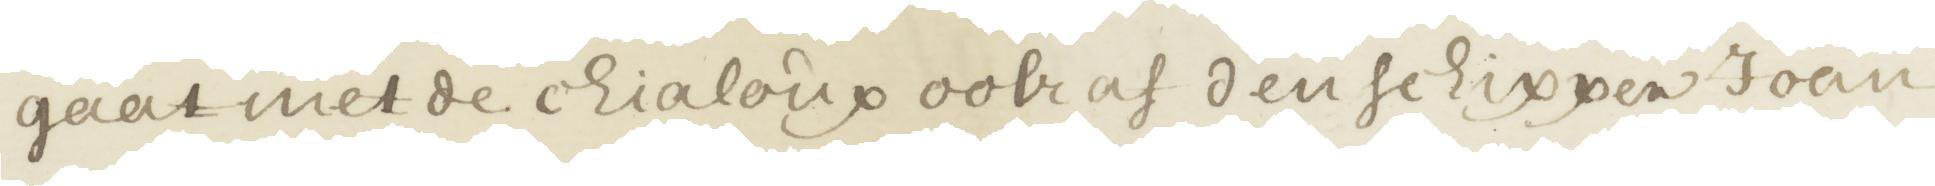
gaat met de chialoup ook af den schipper Joan
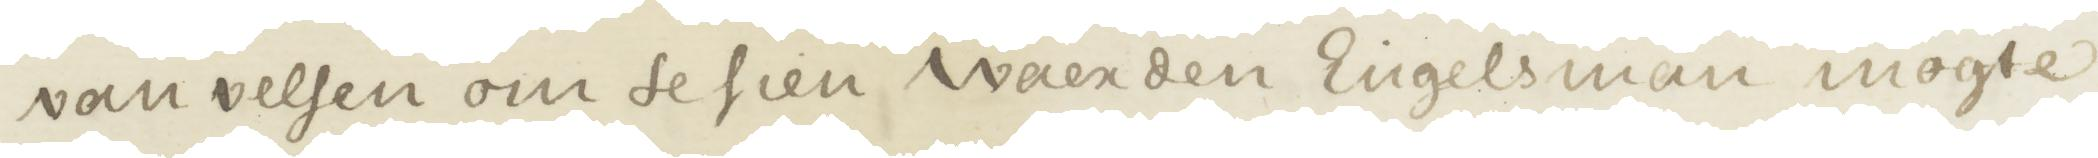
van velsen om te sien waer den Engelsman mogte
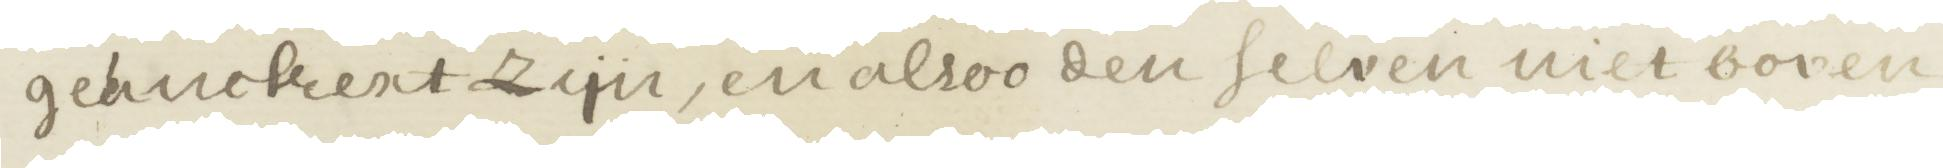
ge'anckert zijn, en alsoo den selven niet boven
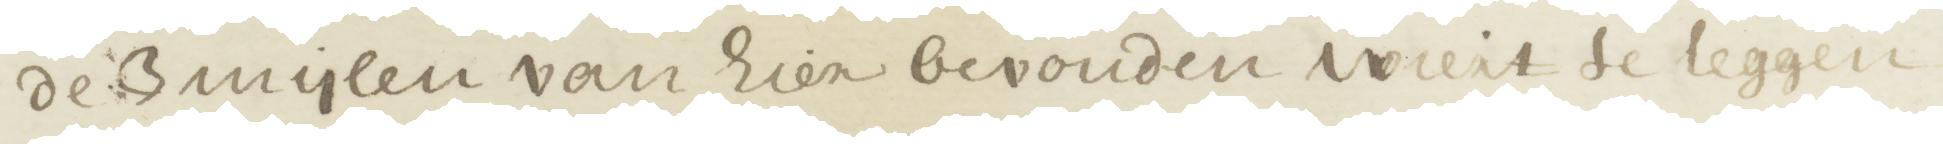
de 3 mijlen van hier bevonden wiert te leggen
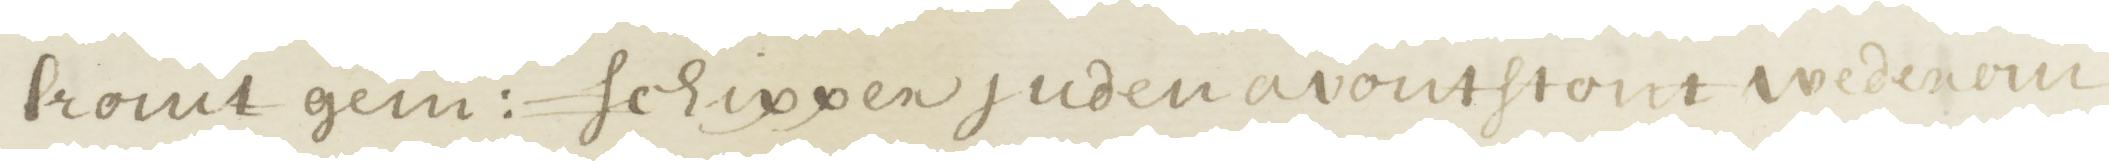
komt gem: schipper jnden avontstont wederom
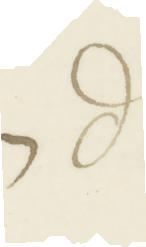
7 d
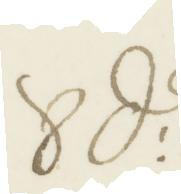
8 d:o
